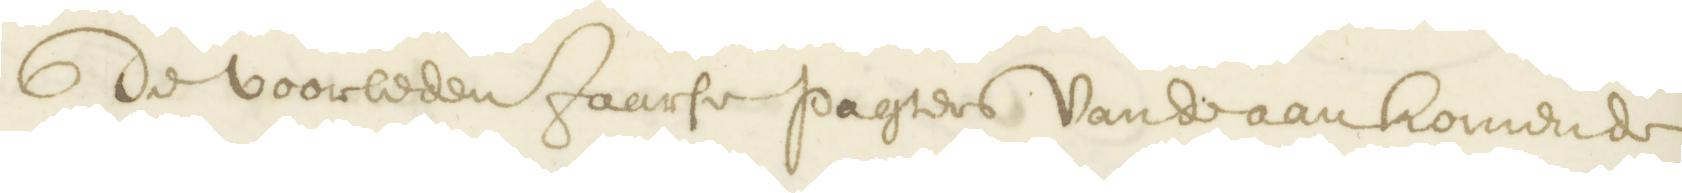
de voorleden jaarse pagters van de aankomende
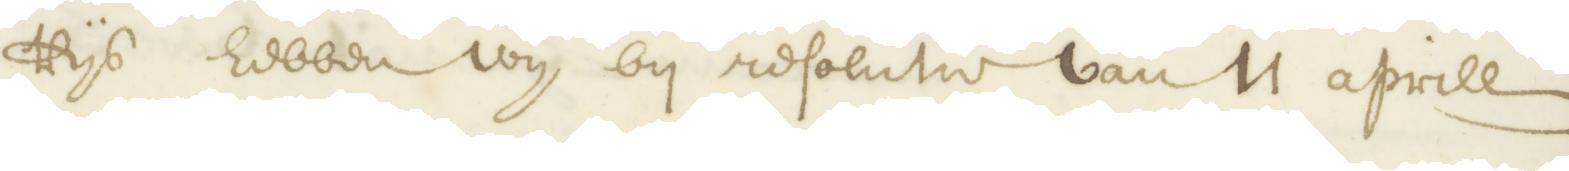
Rijs hebben wij bij resolutie van 11 aprill
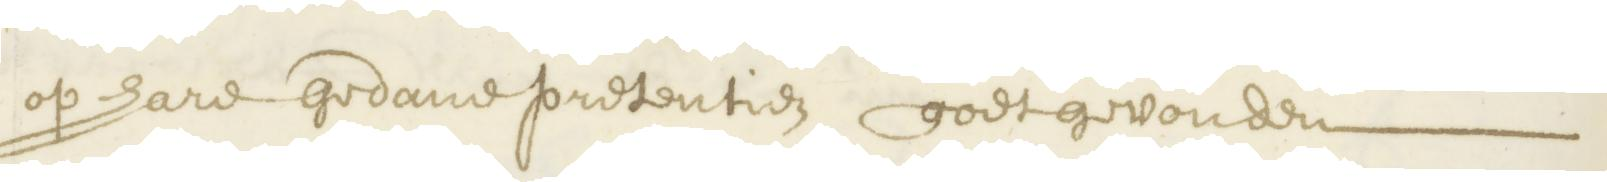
op hare gedane presentien goetgevonden
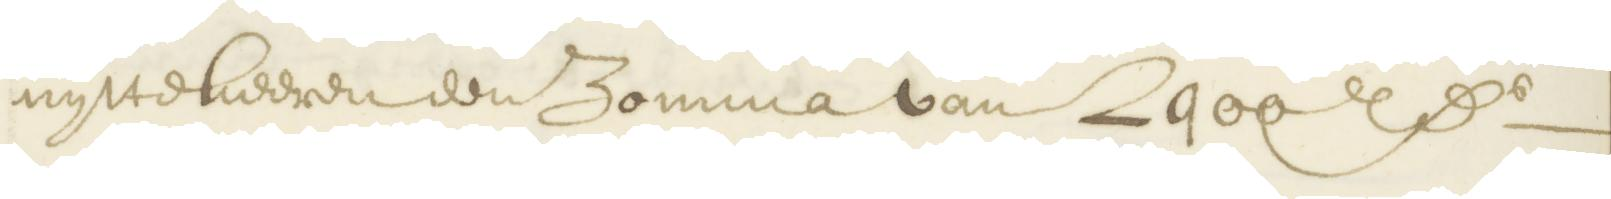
uijttekeeren een Zomma van 2400 ƒs
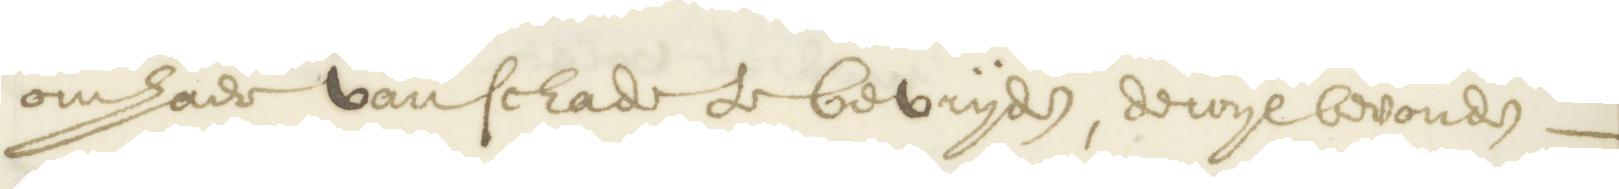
om haer van schade te bevrijden, dewijl bevonden
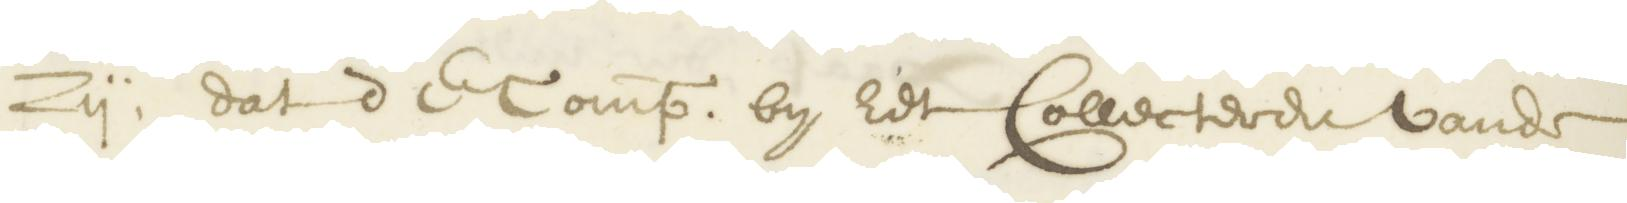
zij, dat d’ EComp. bij het Collectere vande
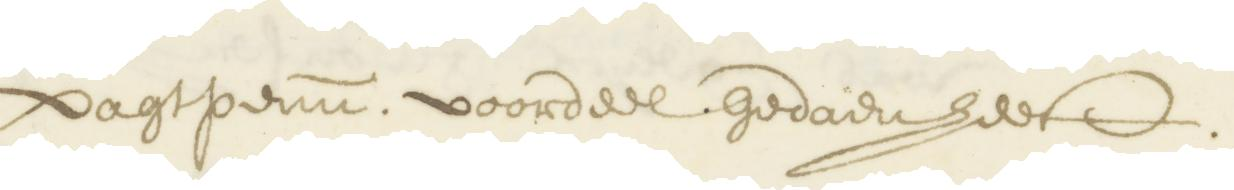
pagtpenn. voordeel gedaen heeft.
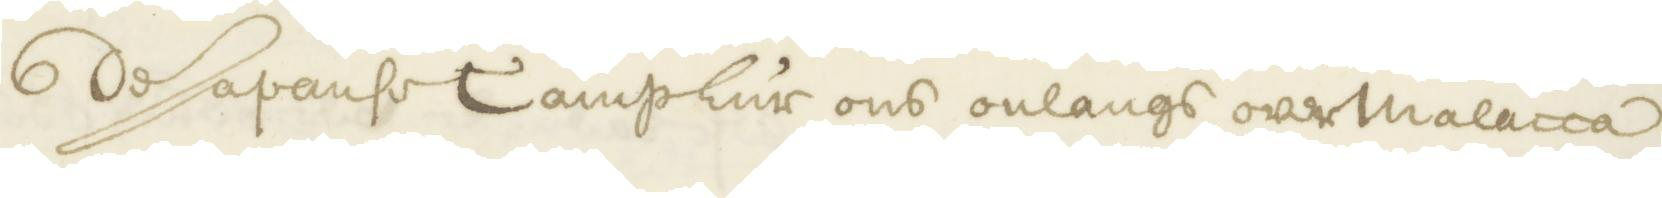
De Japanse Camphur ons onlangs over Malacca
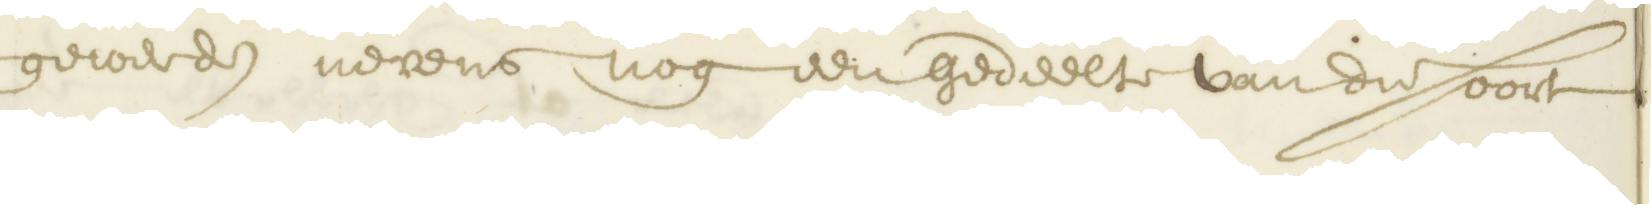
gewerden nevens nog een gedeelte van die soort
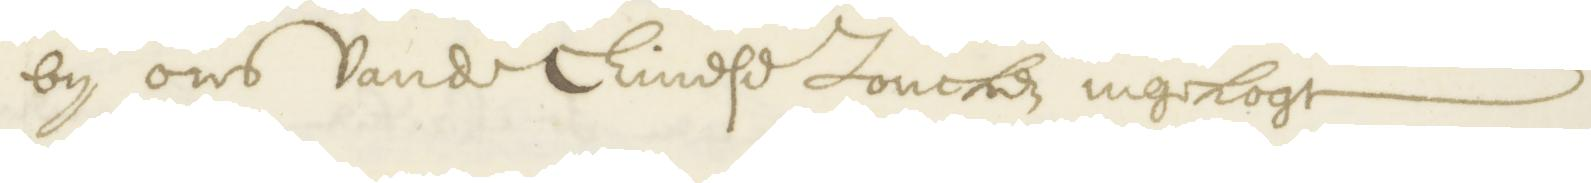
bij ons van de Chinese zoucken ingekogt
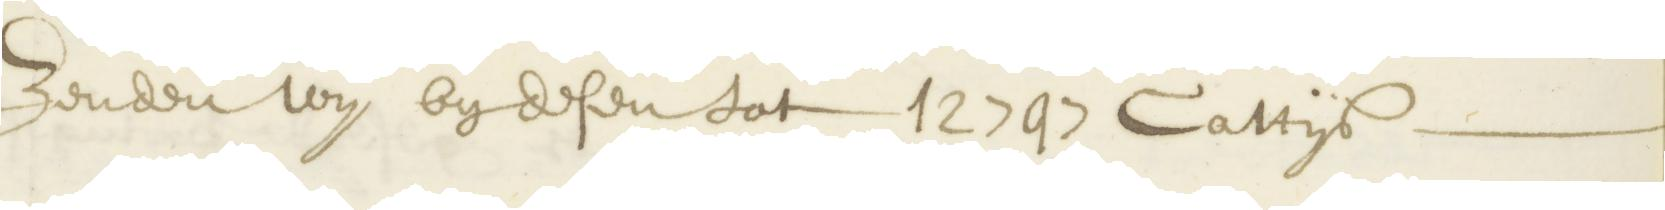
Zenden wij bij desen tot 12747 Cattijs
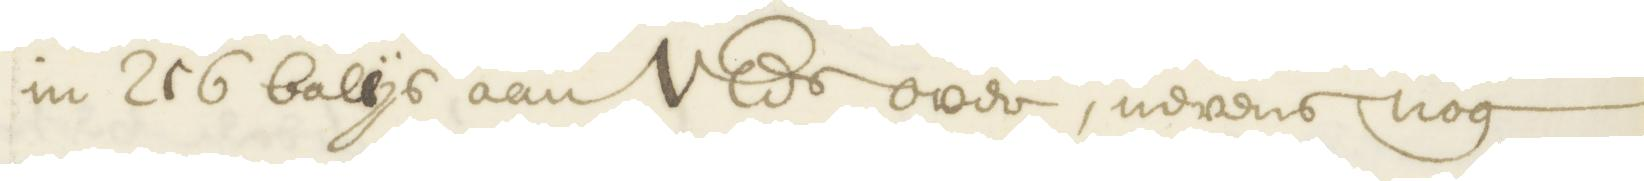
in 256 balijs aan UEds over, nevens nog
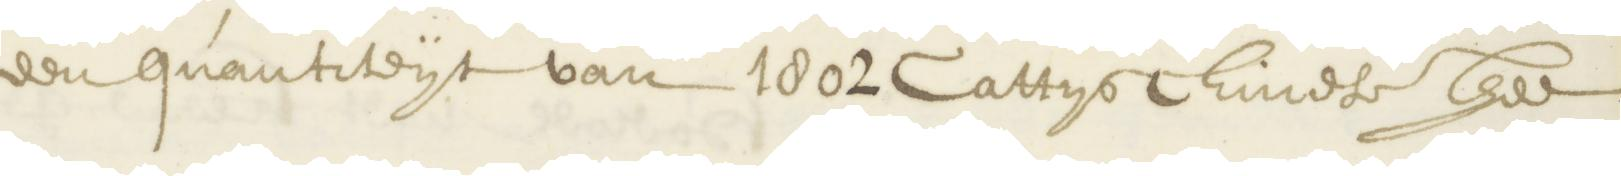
een quantiteijt van 1802 Cattijs Chinese Thee
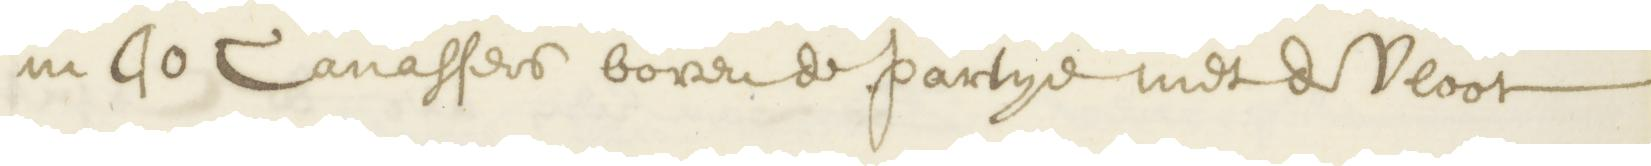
in 40 Canassers boven de partije met de vloot
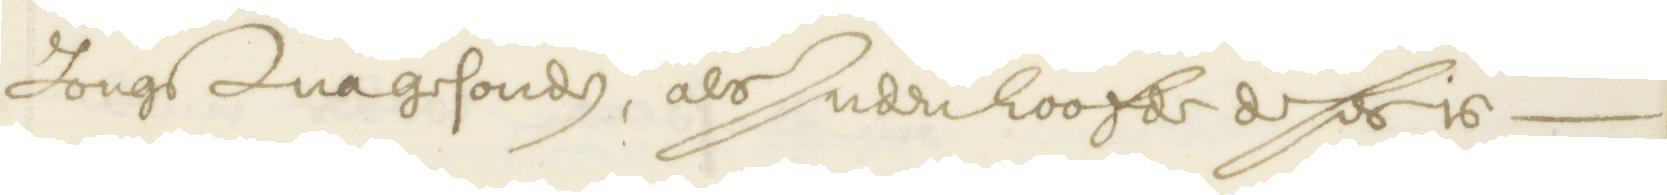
jongst nagesonden, als Inden hoofde de ps is
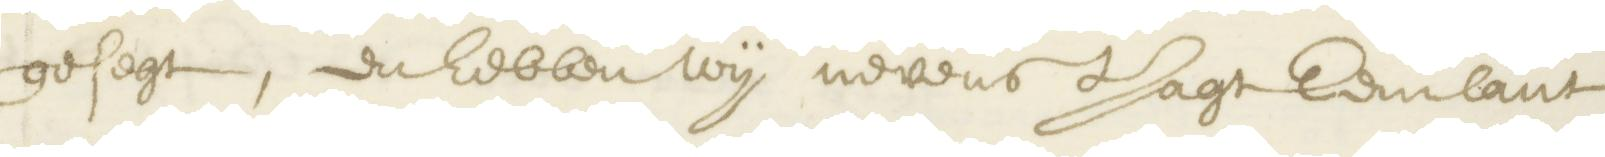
gesegt, en hebben wij nevens t Jagt Eemlant
